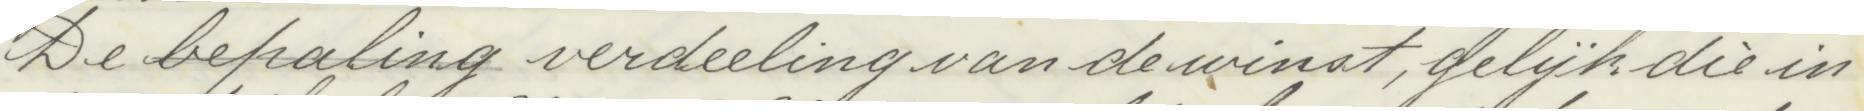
De bepaling verdeeling van de winst, gelijk die in
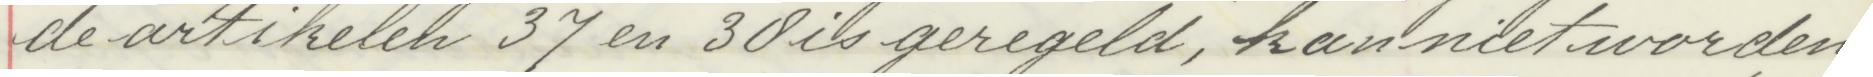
de artikelen 37 en 38 is geregeld, kan niet worden
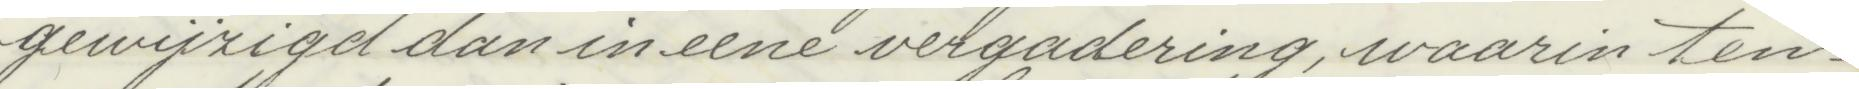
gewijzigd dan in eene vergadering, waarin ten-
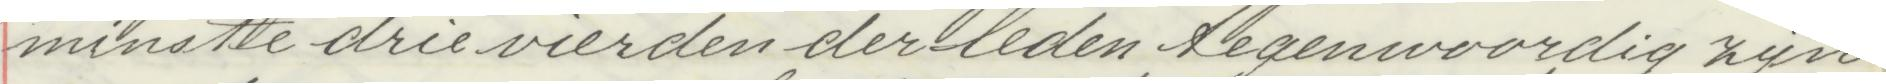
minste drie vierden der leden tegenwoordig zijn
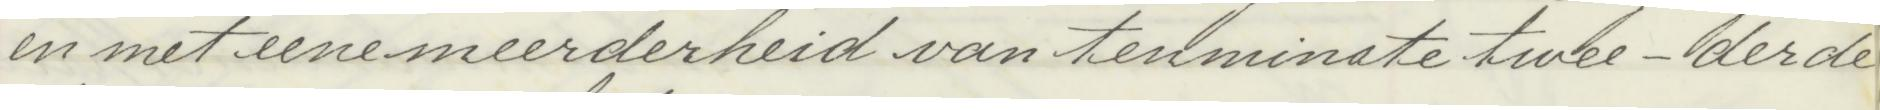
en met eene meerderheid van tenminste twee - derde
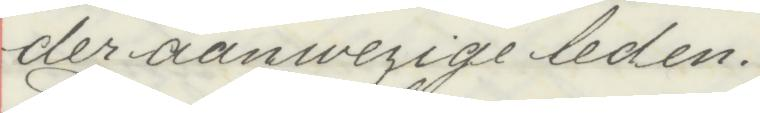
der aanwezige leden.
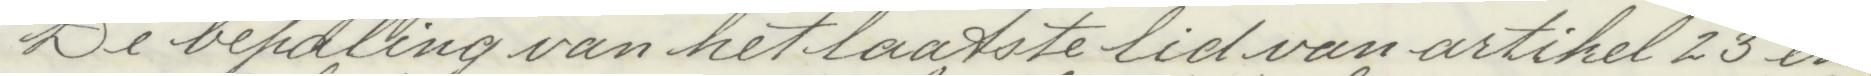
De bepaling van het laatste lid van artikel 23 en
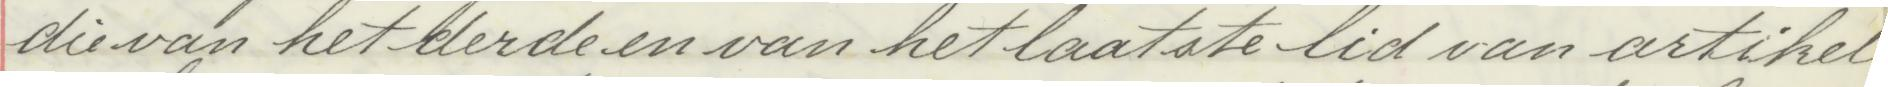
die van het derde en van het laatste lid van artikel
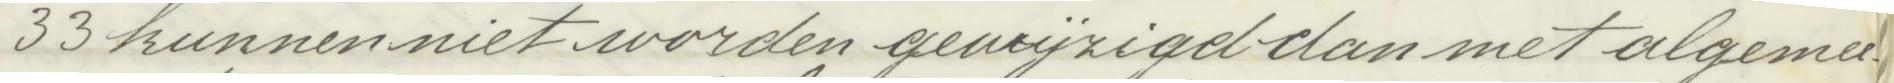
33 kunnen niet worden geneijzigd dan met algemee-
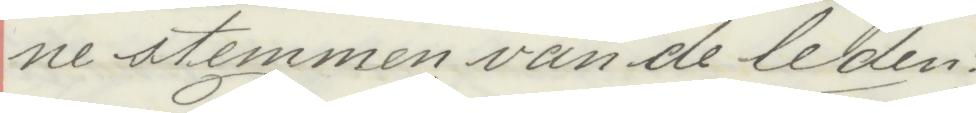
ne stemmen van de leden.
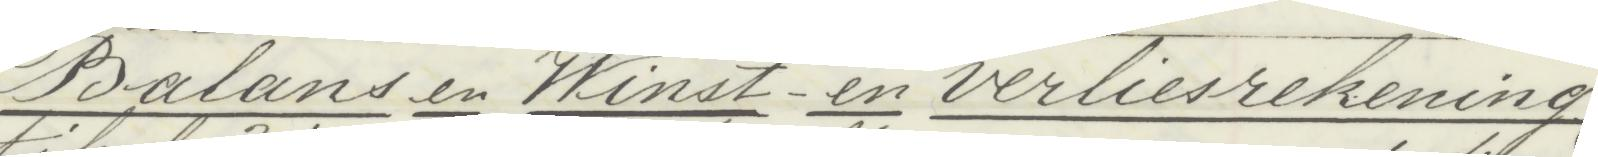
Balans en Winst- en verliesrekening
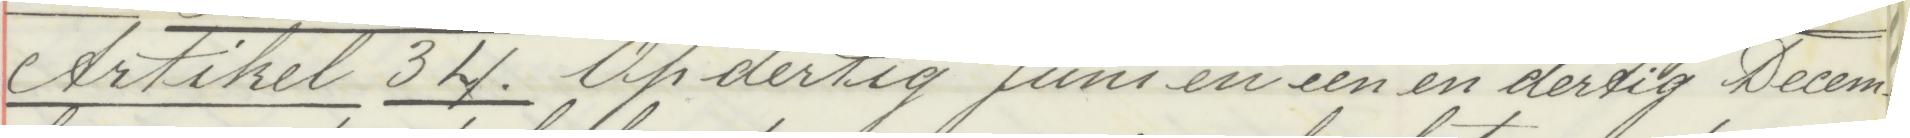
Artikel 34. Op dertig Juni en een en dertig Decem
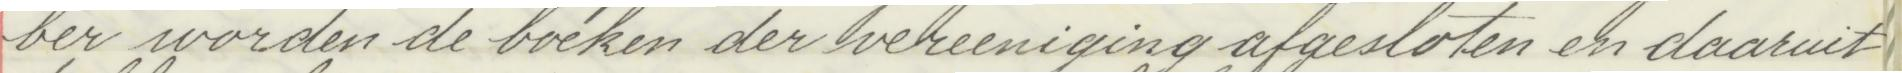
ber worden de boeken der vereeniging afgesloten en daaruit
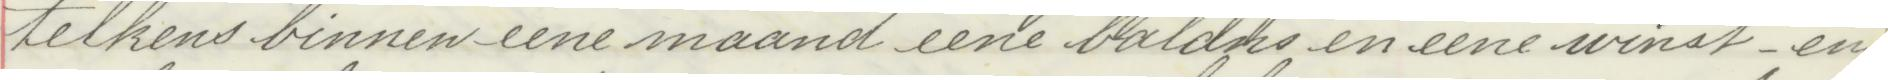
telkens binnen eene maand eene balans en eene winst- en
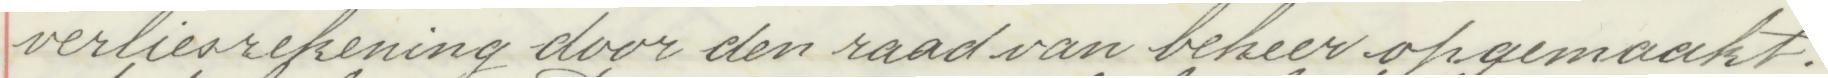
verliesrekening door den raad van beheer opgemaakt.
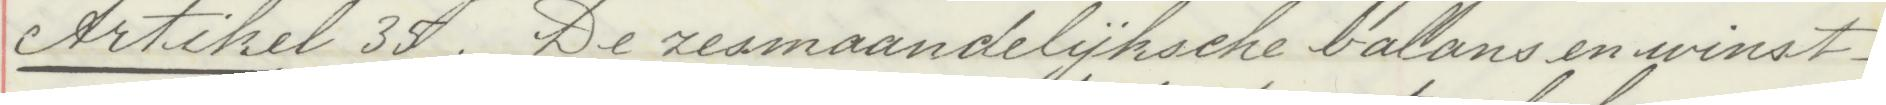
Artikel 35. De zesmaandelijksche balans en winst-
